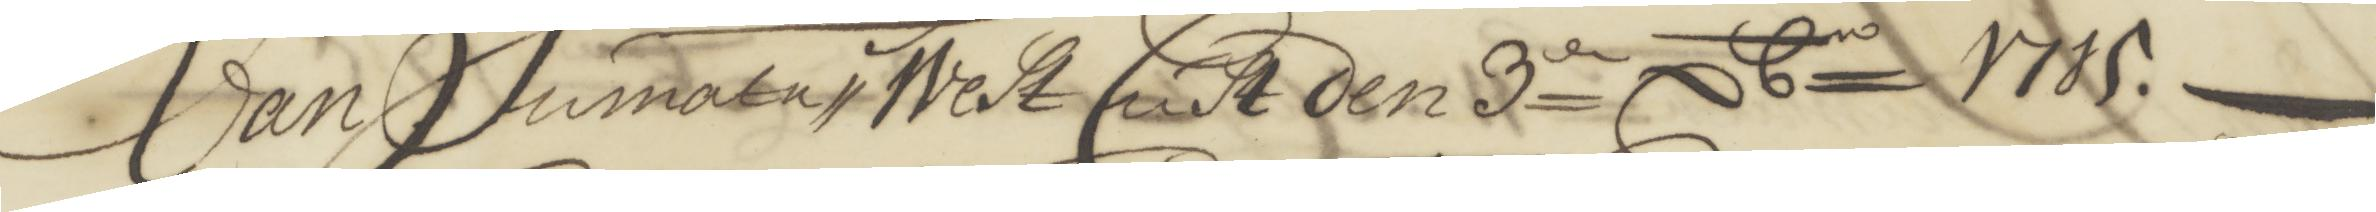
Van Sumatr„ West Cust den 3:en xb=r 1715.—
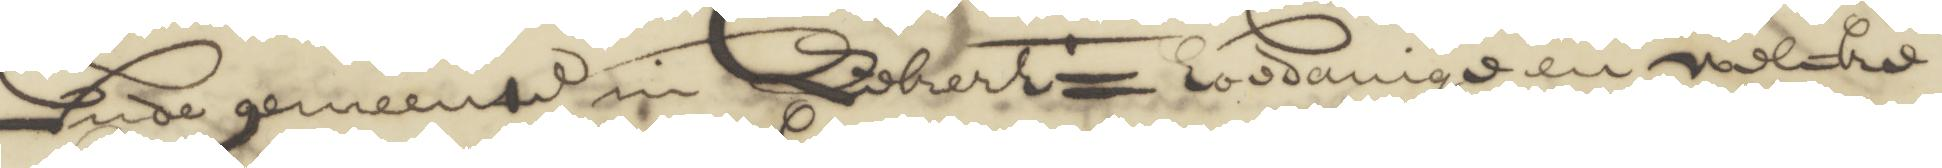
Ende gemeente in zekerh=t hoe danige en welcke
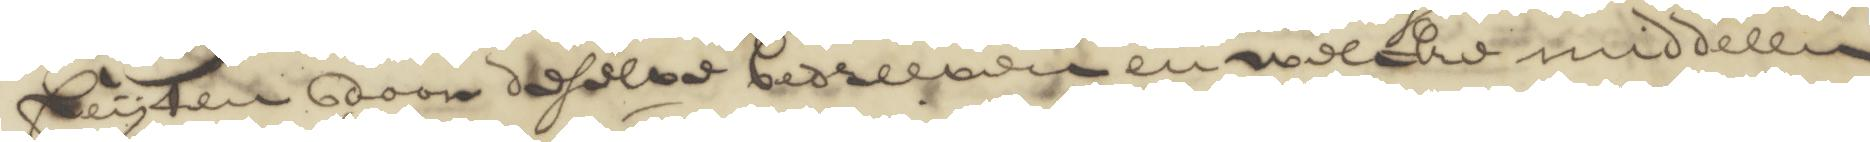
feijten door deselve bedreeven en welcke middelen
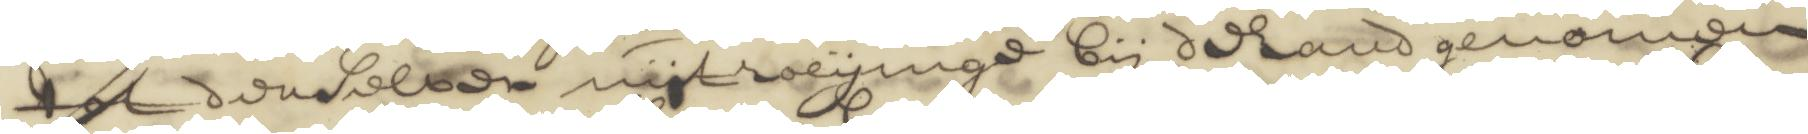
tot derselven uijtroelijinge bij de hand genomen
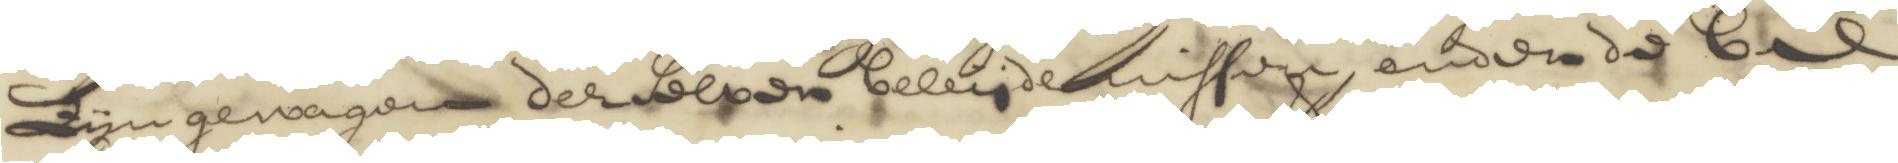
Zijn gewagen derselven beleijdenissen, en den de be
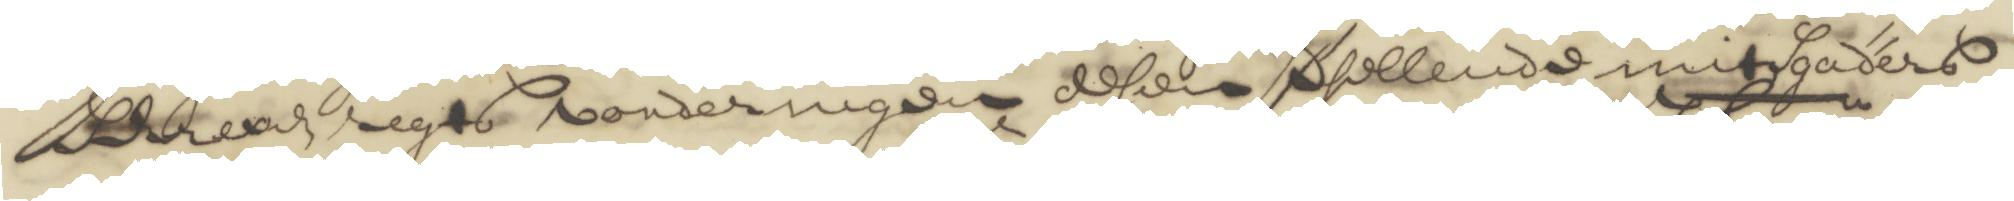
schreven regts vorderingen desen versellende mitsgaders
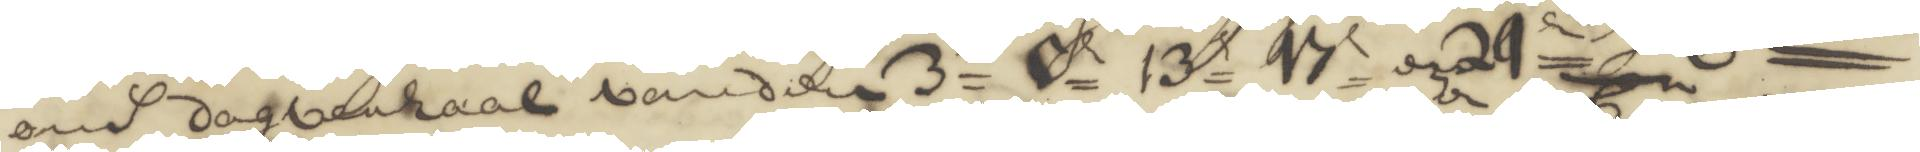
ons dag verhaal van den 3=e 5=e 13=e 17=e 24=e 7b=r
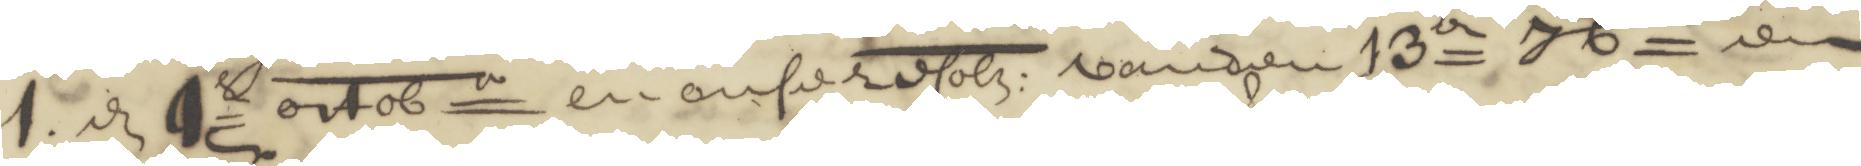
1. en 4=en octob=r en onse resol: van den 13=en, 7b=r en
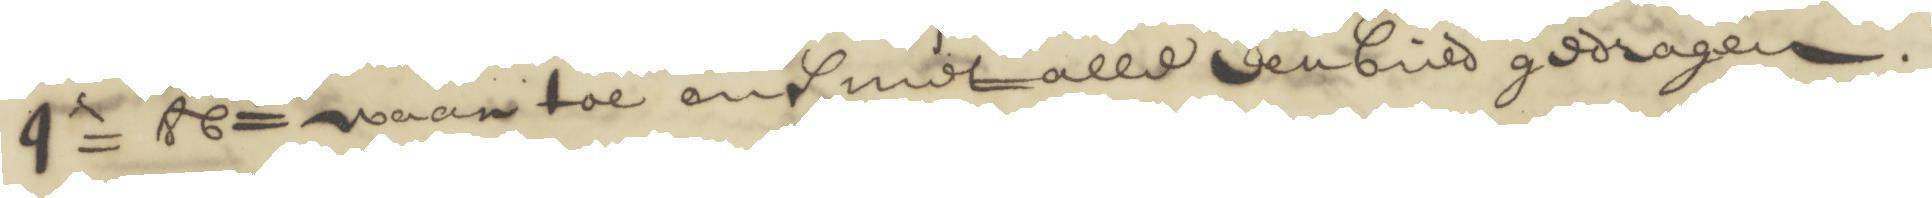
4=e 8b=r waar toe ons met alle Eerbied gedragen.
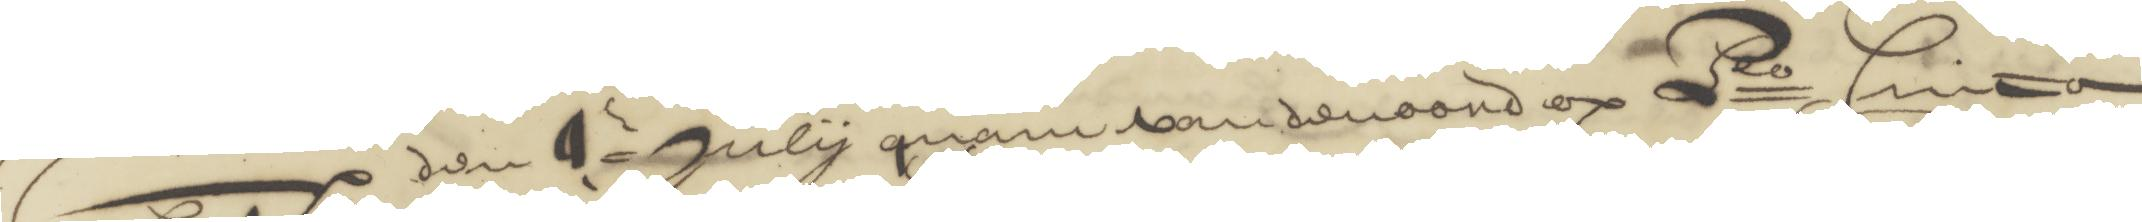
Op den 4=en julij quam van de noord op P=lo cinco
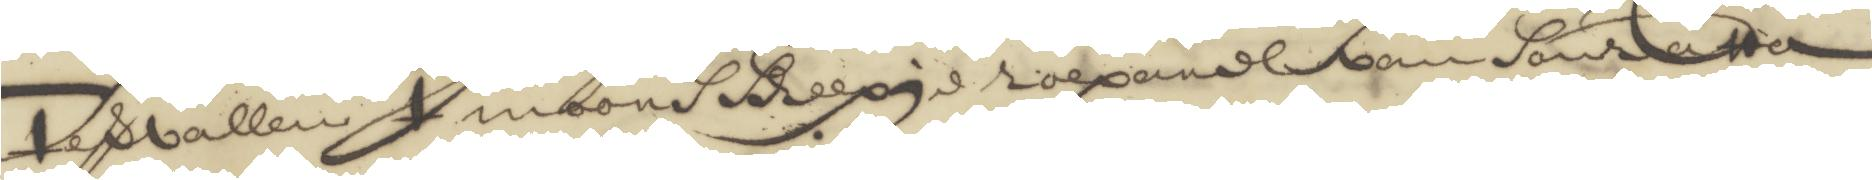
te vervallen 't moors scheepje roeparel van souratta
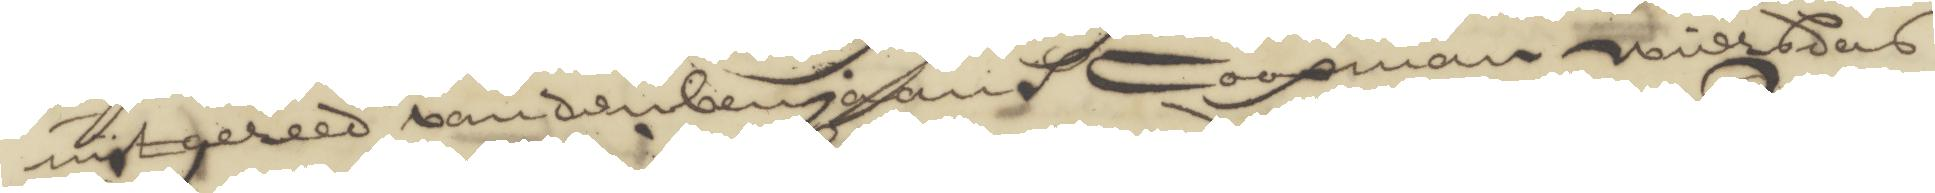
uijt gereed van den benjaans Coopman wiersders
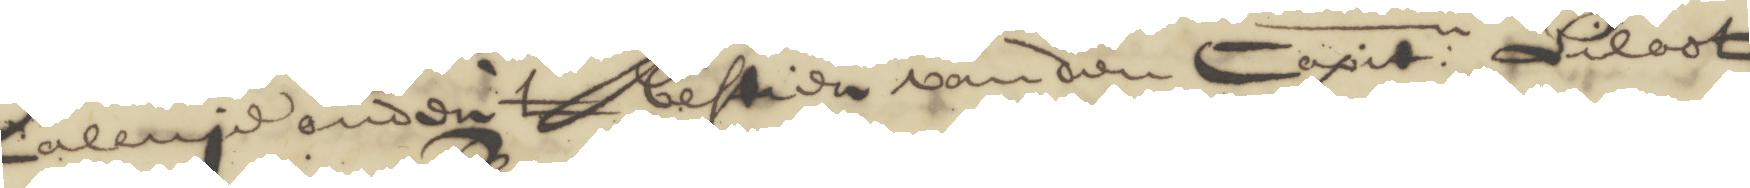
calenje onder ’t bestier van den Capit:n Piloot
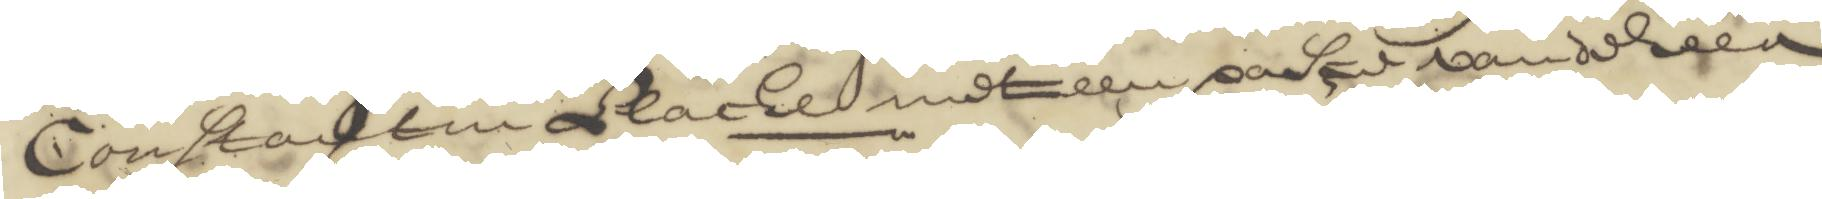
Constantin Plache met een pasçe van de heer
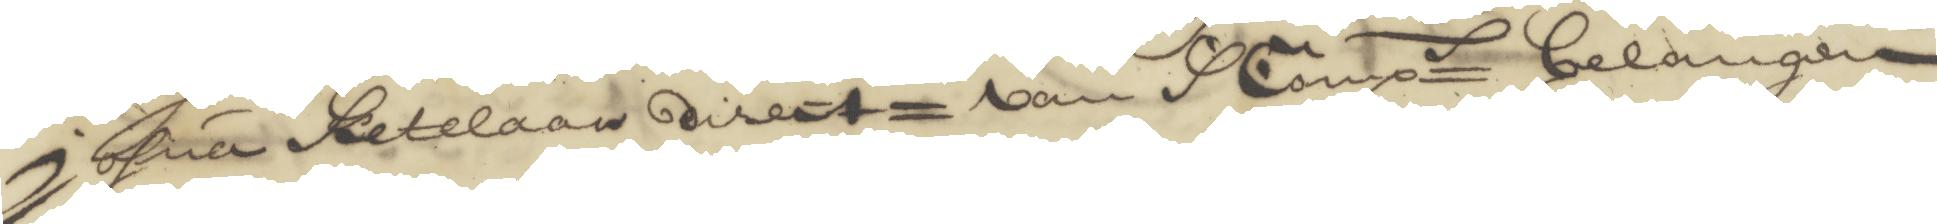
josua ketelaar direct=r van ’s Comp=s belangen
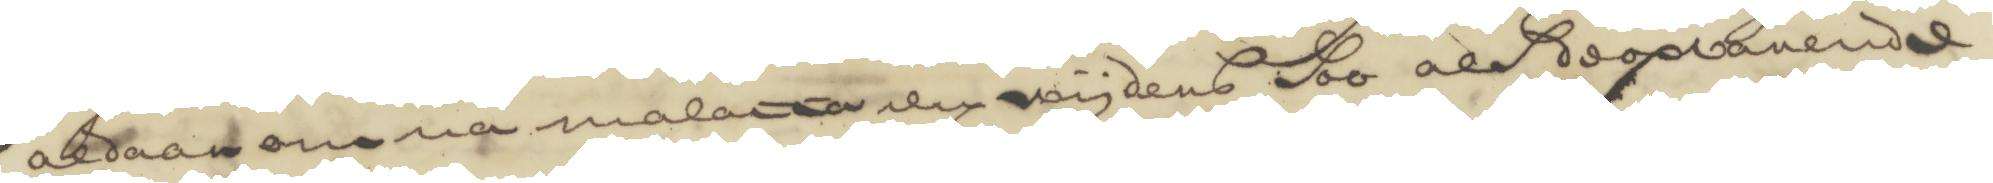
aldaar om na malacca en wijders Soo als de opvarende
